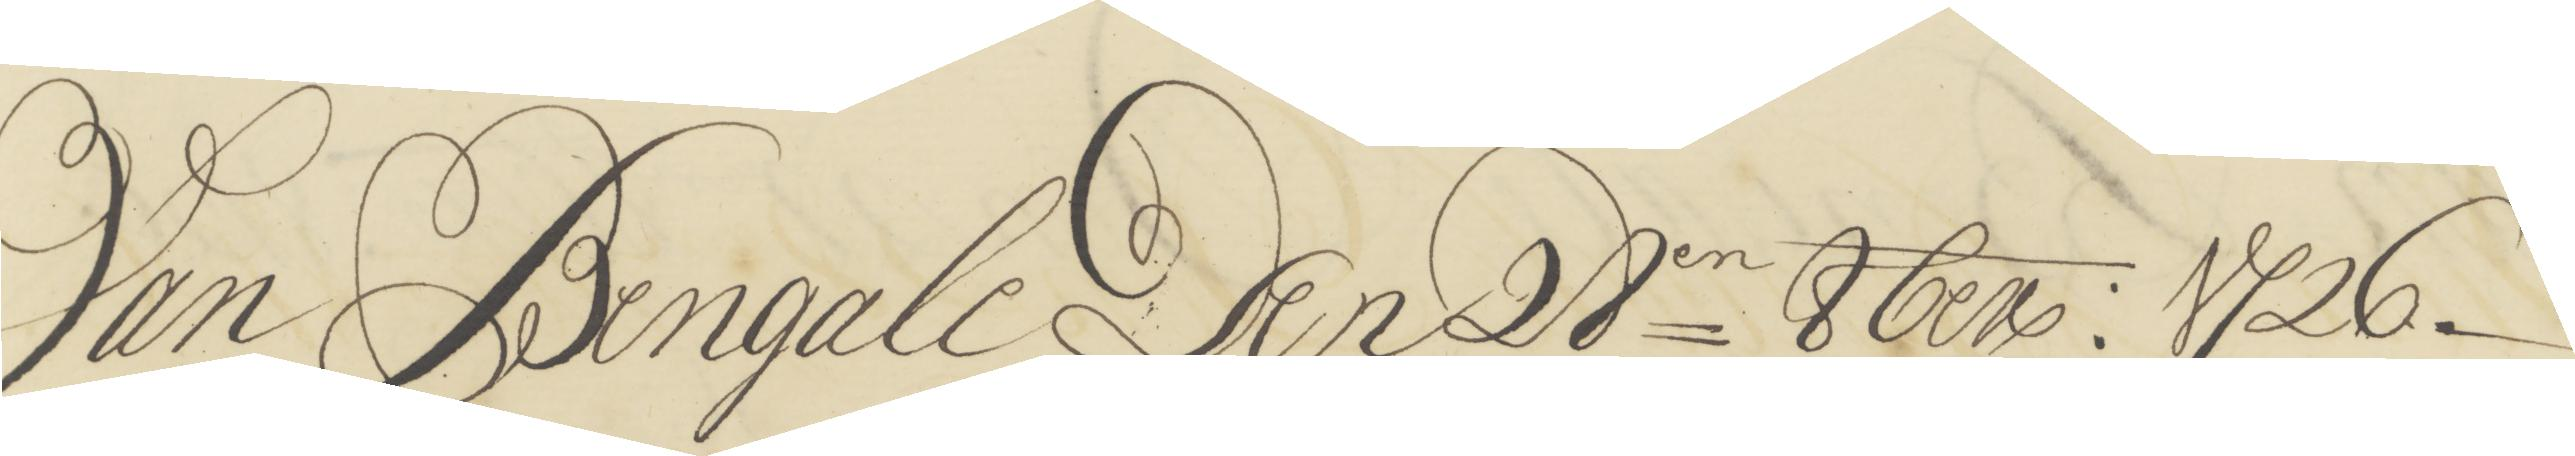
Van Bengale Den 28=en 8ber: 1726.
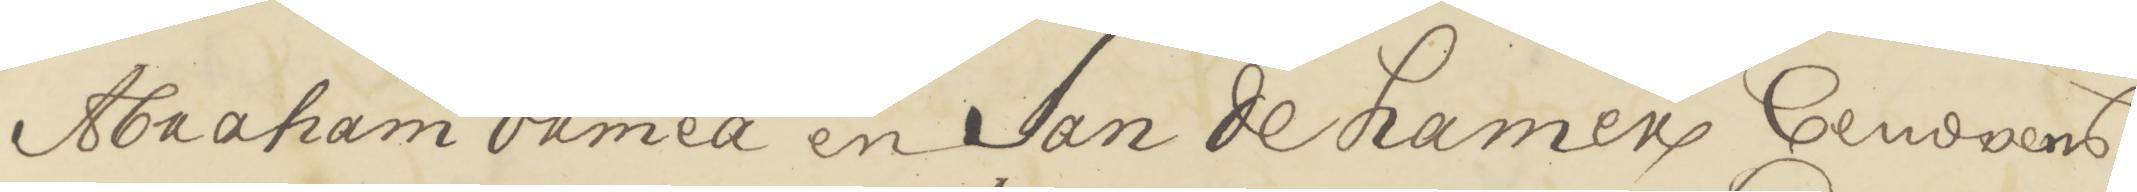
Abraham Ormea en Jan de hamer benevens
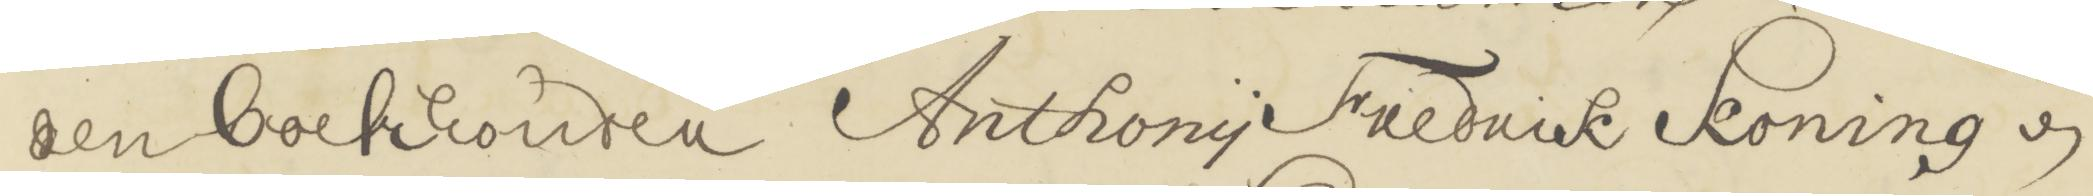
den boekhouder Anthonij Fredrik Koning en
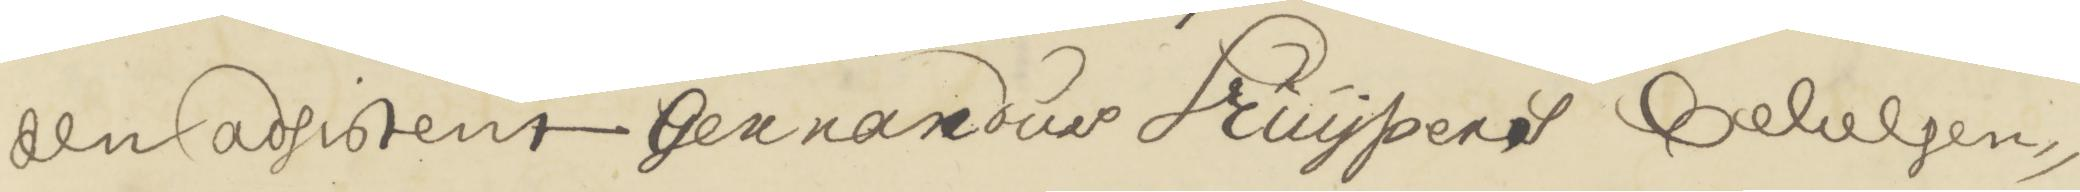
den adsistent Gerardus Kuijpers behelpen„
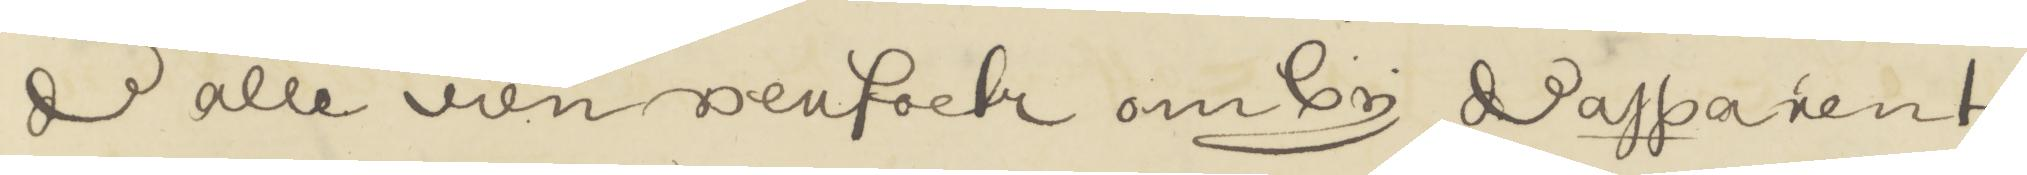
de alle een versoek om bij de apparent
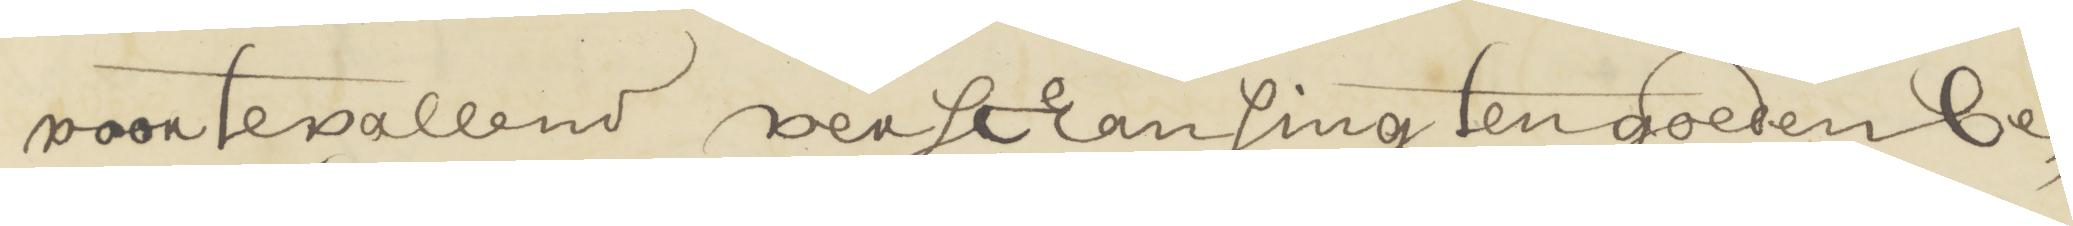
voor tevallene verschansing ten goeden be„
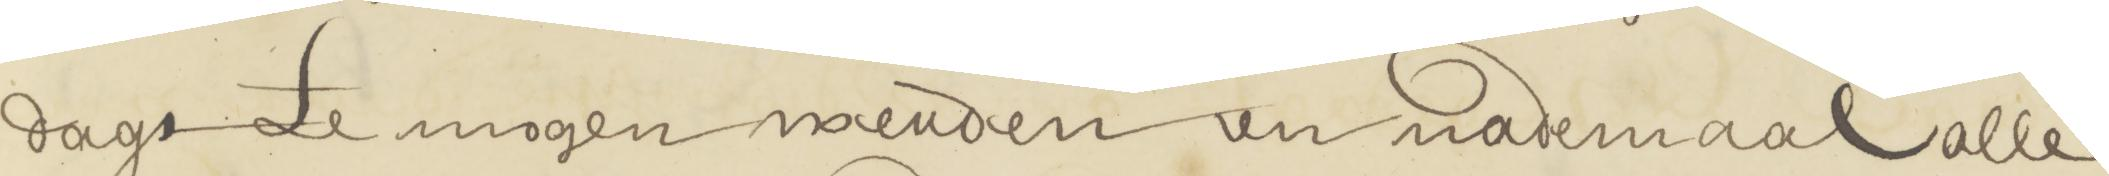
dagt te mogen werden en nademaal alle
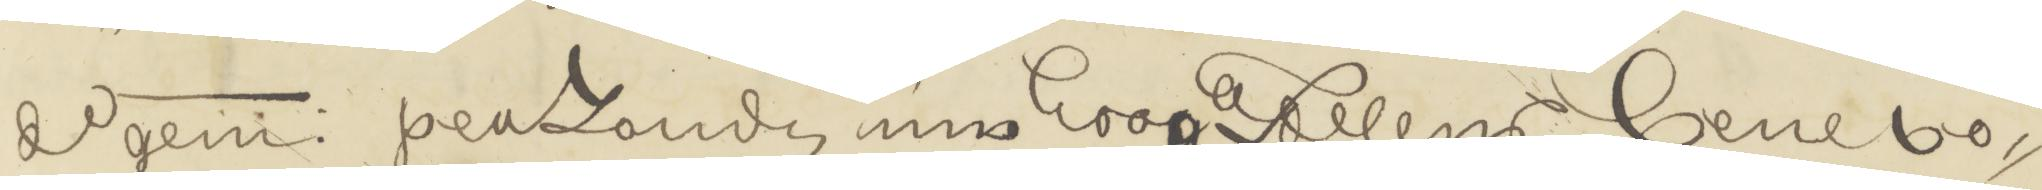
de gem: perzonen uw hoog Edelens benevo„
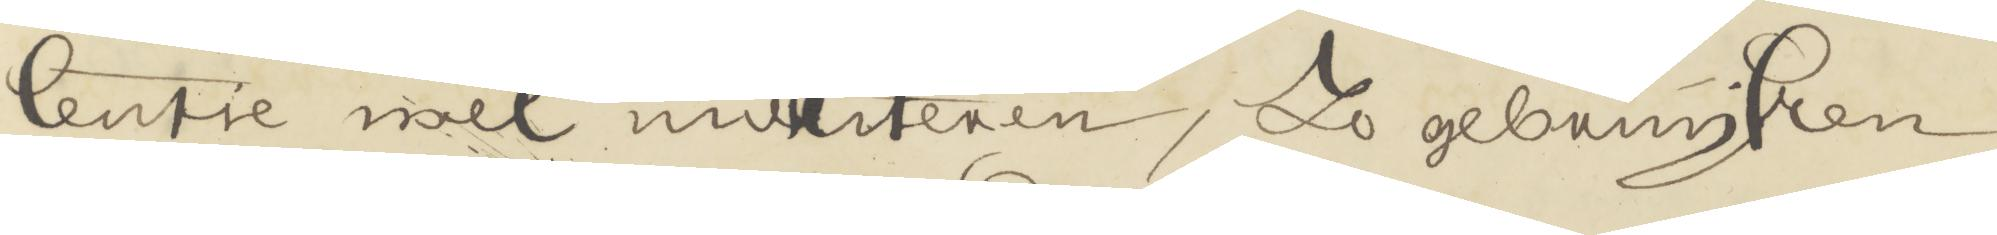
lentie wel meriteren, zo gebruijken
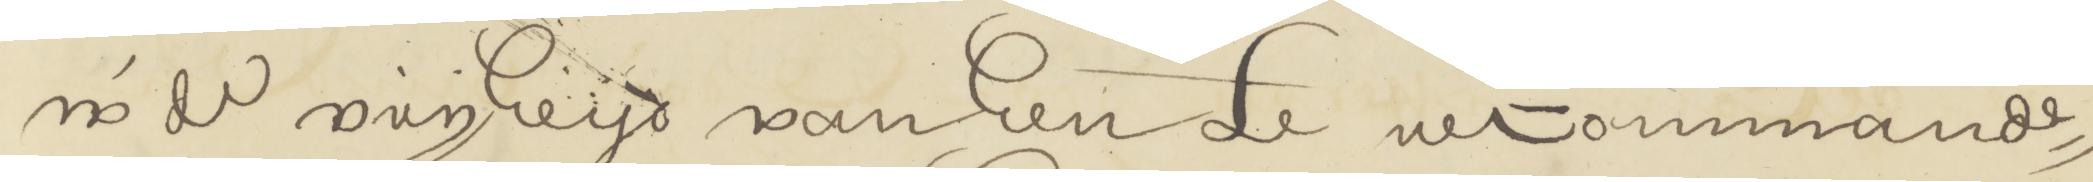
w' de vrijheijd van hen te recommande„
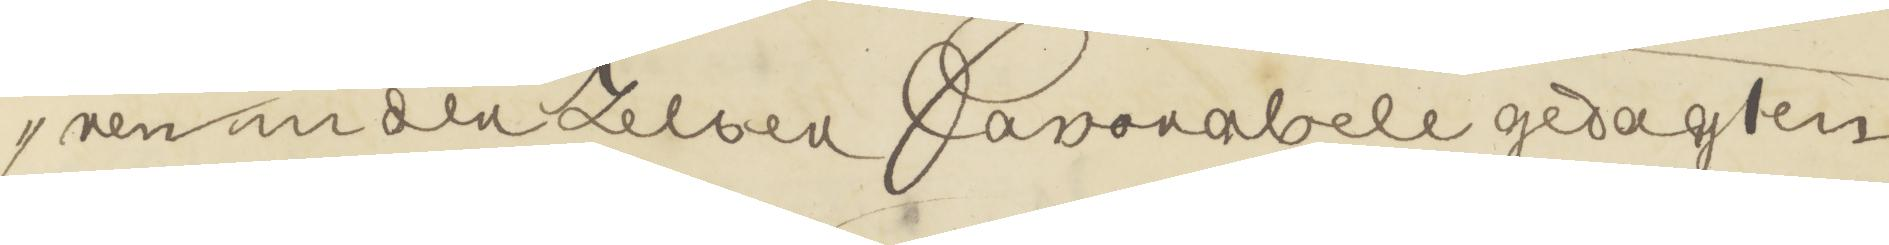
„ren in der zelver favorabele gedagten.
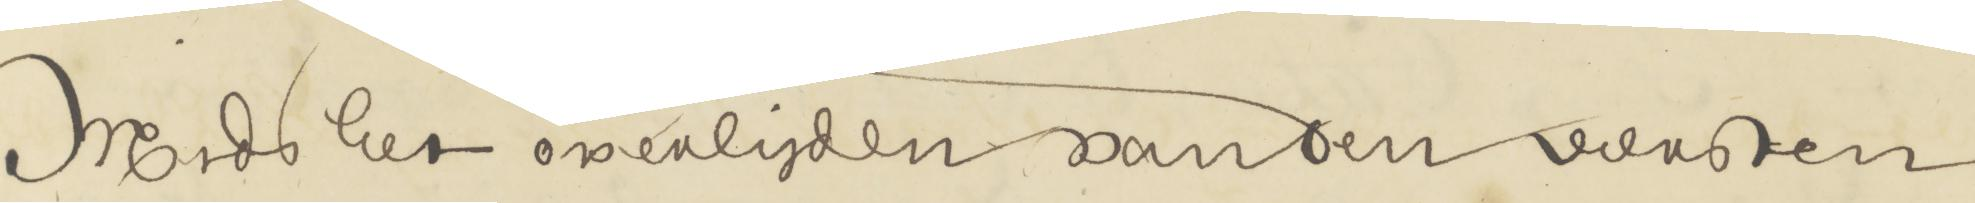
Mids het overlijden van den eersten
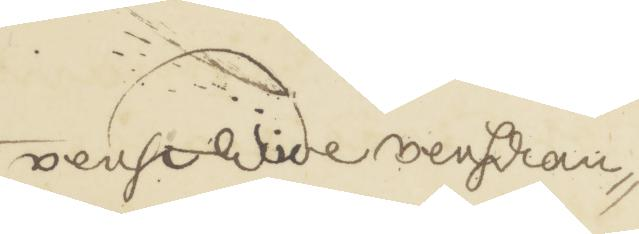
verscheide verschan„
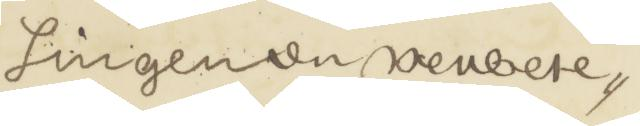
singen en verbete„
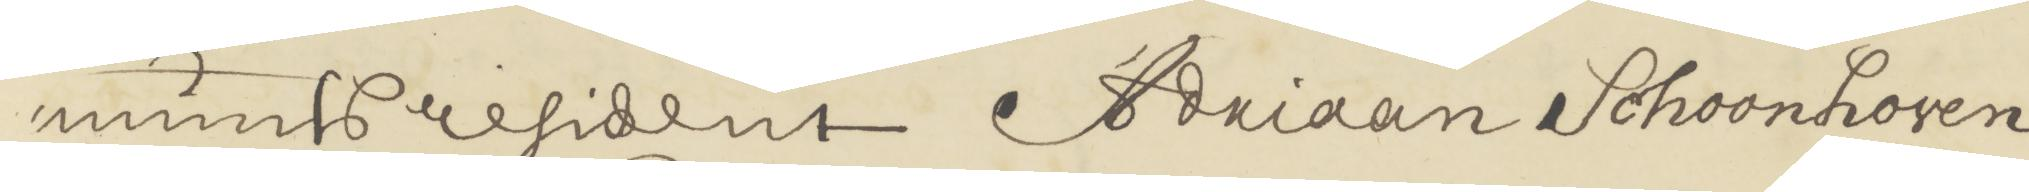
munts resident Adriaan Schoonhoven
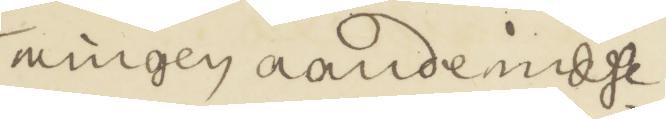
ringen aande in dese
